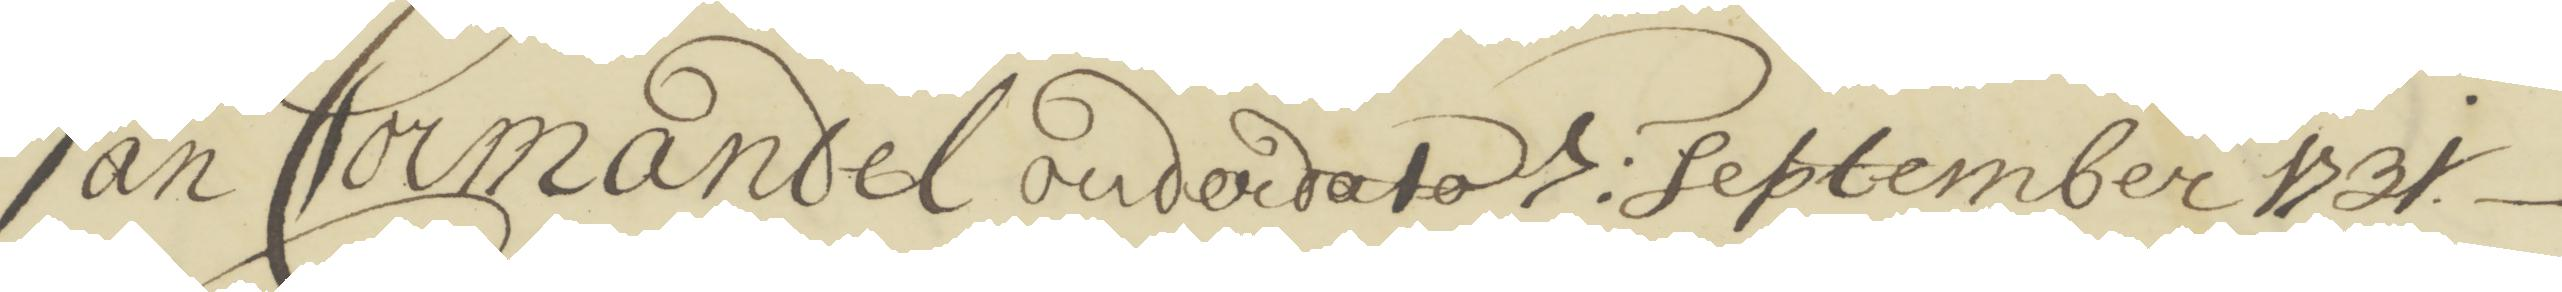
Van Cormandel onder dato 7:' September 1731. —
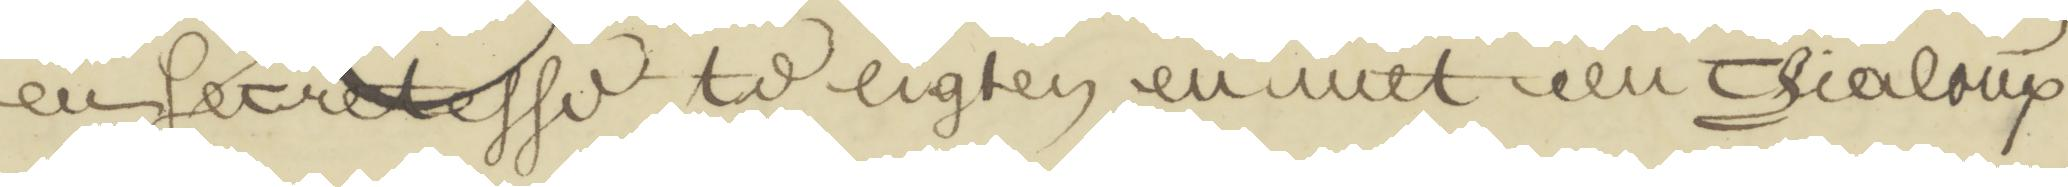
en secretesse te ligten en met een chialoup
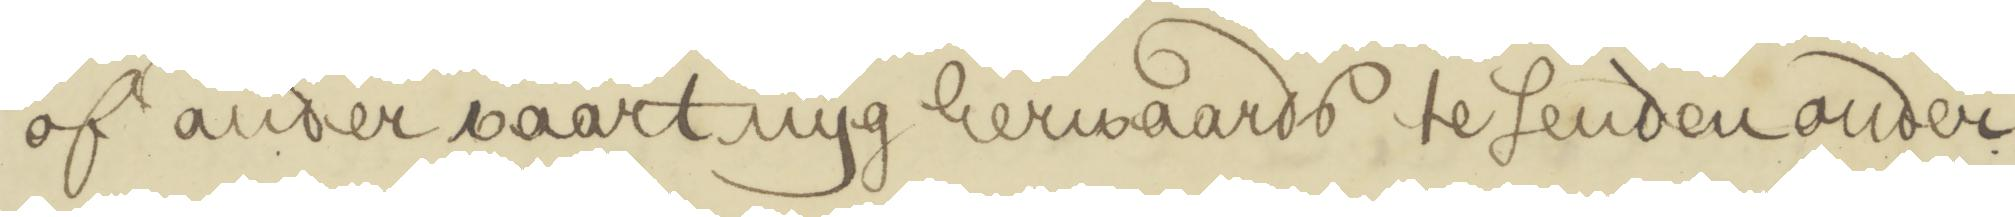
of ander vaartuijg herwaards te senden onder
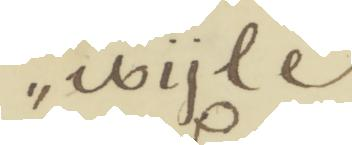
„wijle
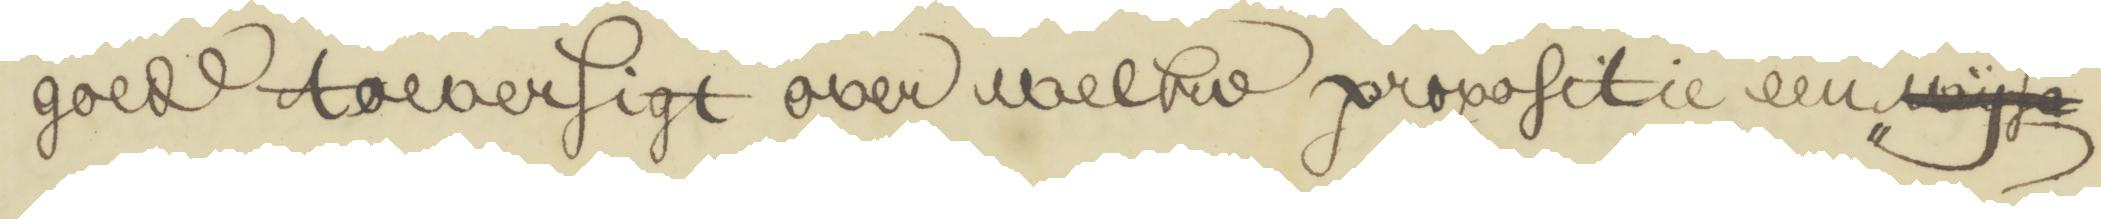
goede toeversigt over welke propositie een „ wijse
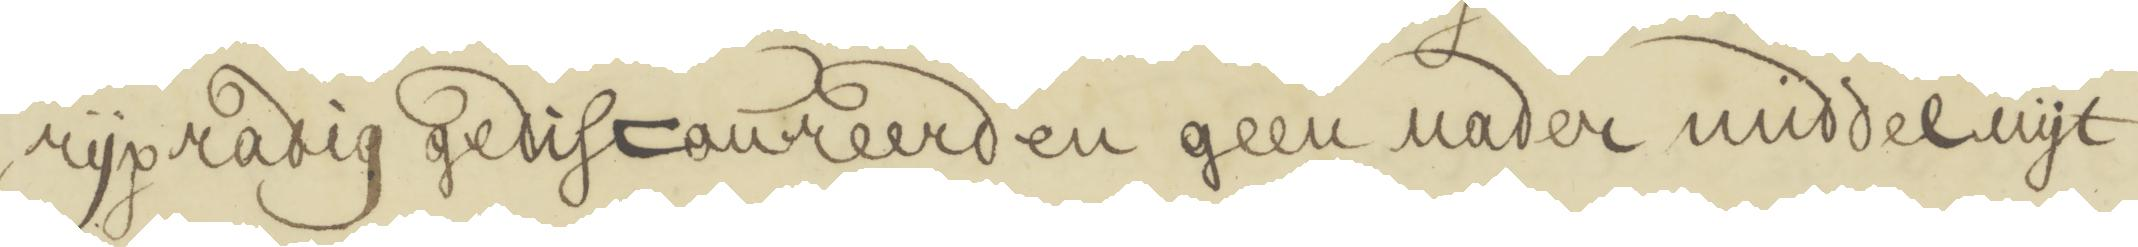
rijpradig gediscoureerd en geen nader middel uijt
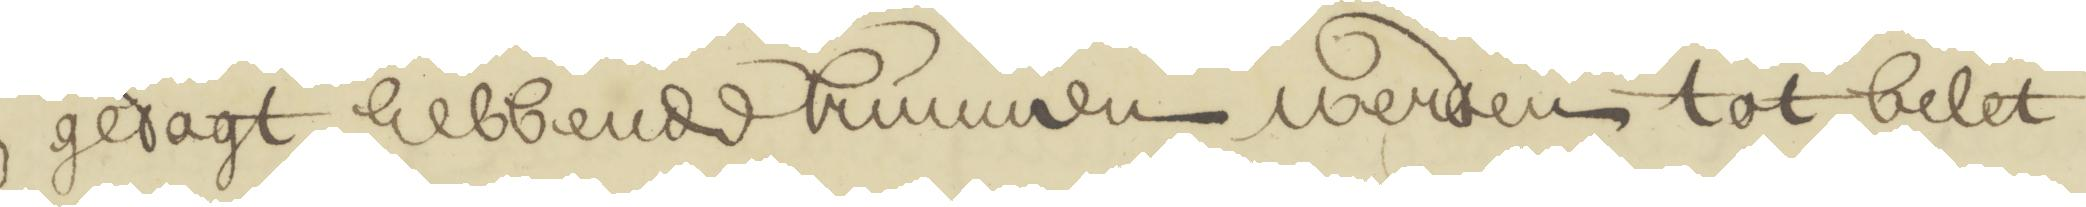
gedagt hebbende kunnen werden tot belet
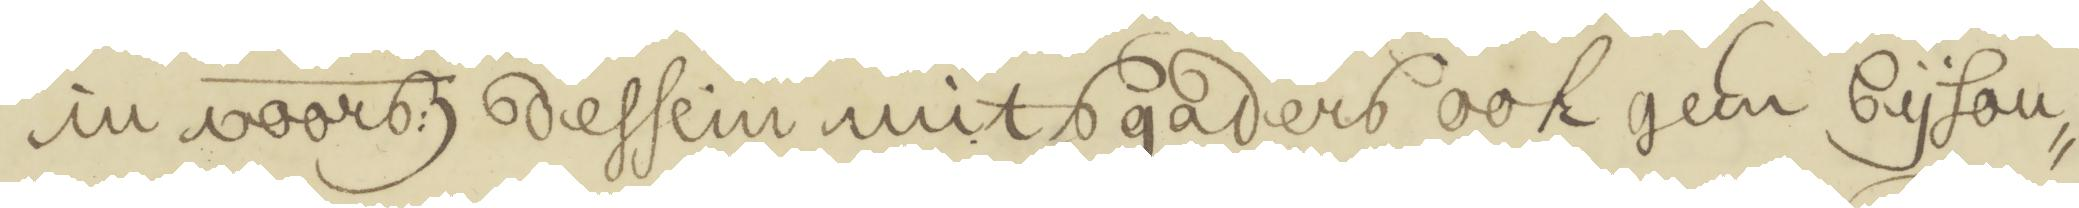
in voors:z dessein mitsgaders ook geen bijson
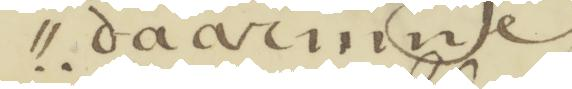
„daarinne
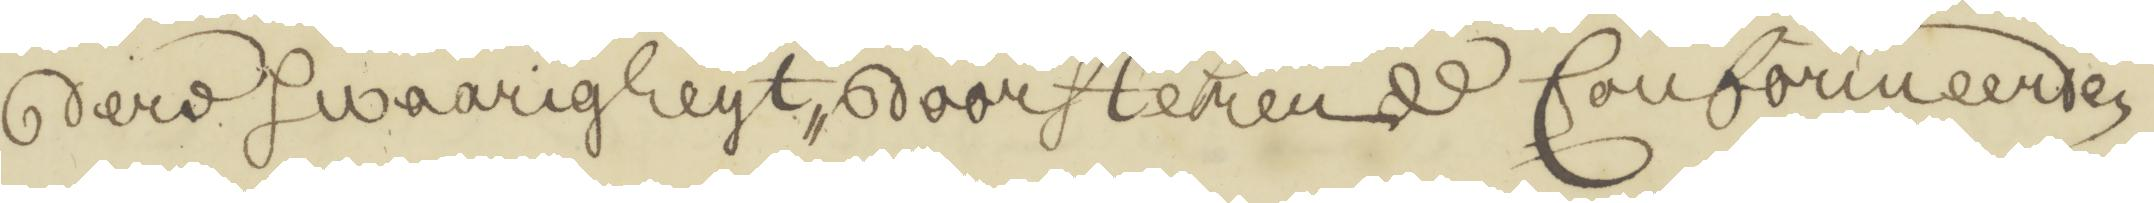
dere swaarigheijt „ door steken de Conformeerden
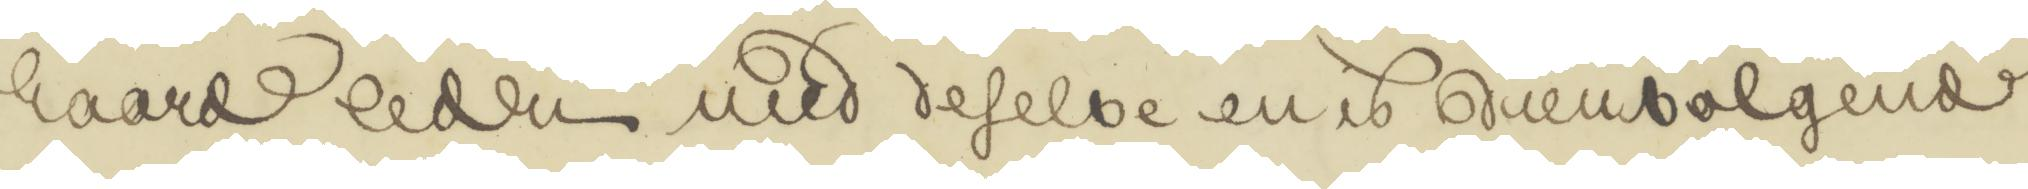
haarde leden med deselve en is dien volgende
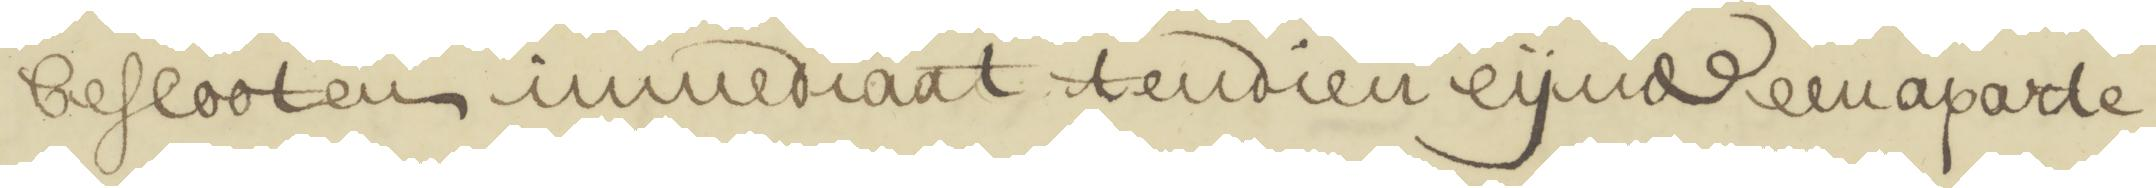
beslooten immediaat ten dien eijnde een aparte
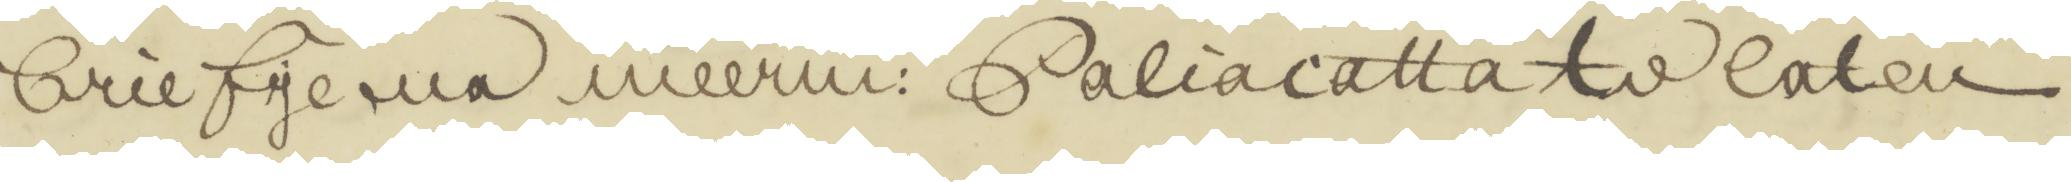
briefje na meerm: Paliacatta te laten
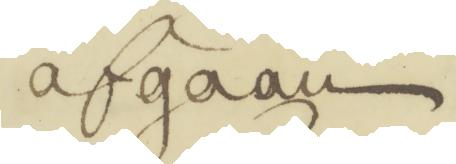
afgaan
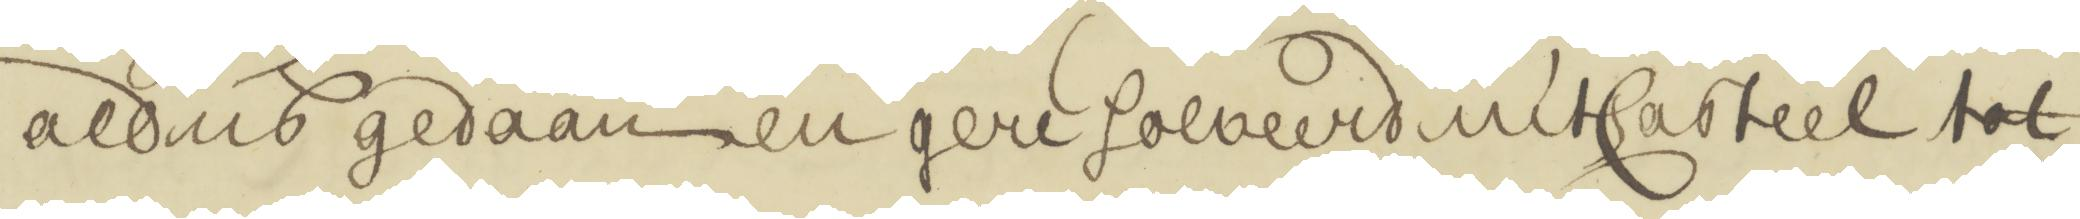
aldus gedaan en geresolveerd in 't Casteel tot
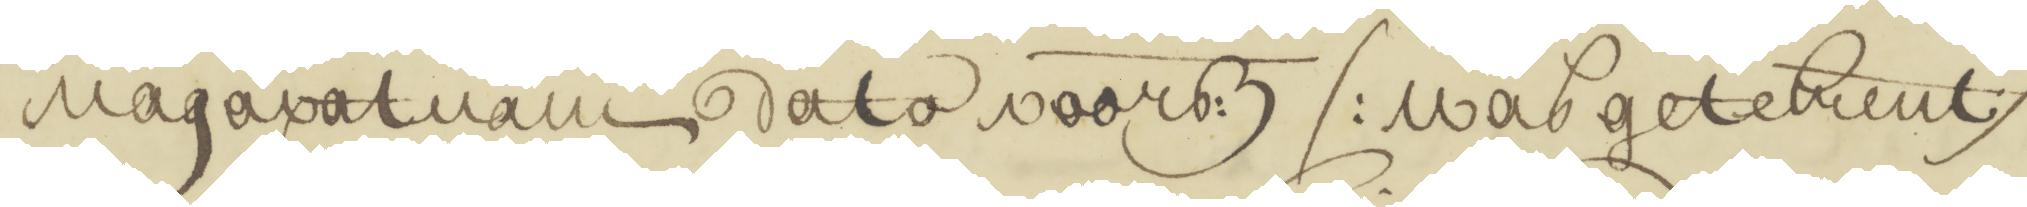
nagapatnam dato voors:z /:was getekent:/
